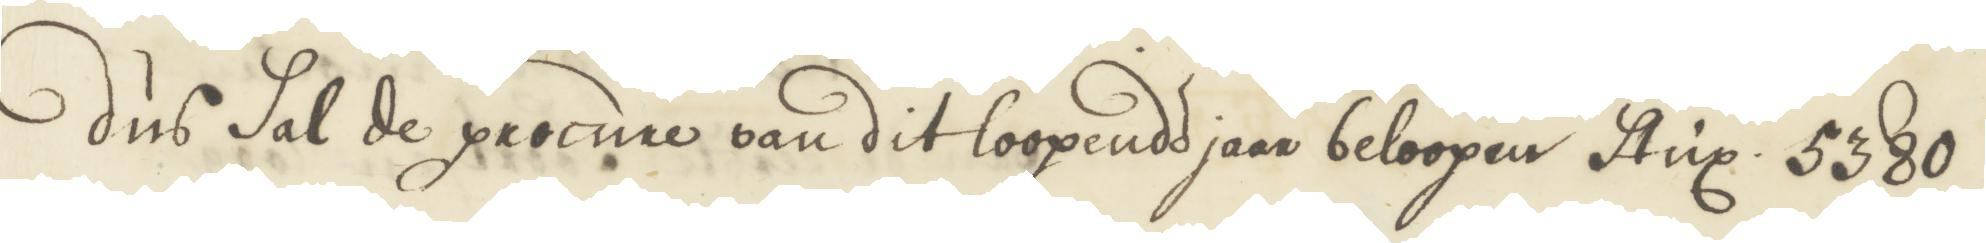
dus sal de procure van dit loopende jaar beloopen stux. 5380
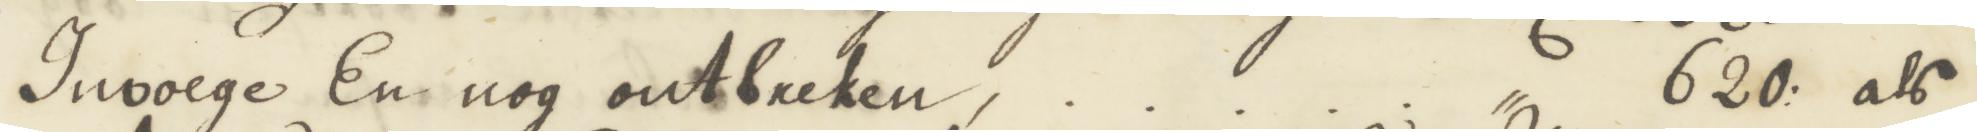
Invoege En nog ontbreken, - - - - - „ 620: als
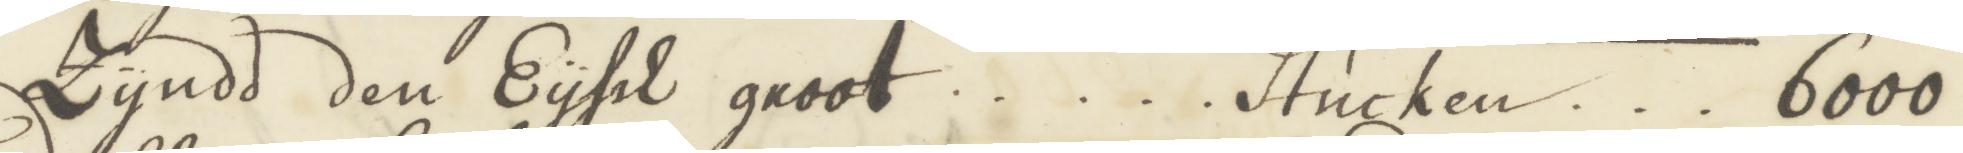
Zijnde den Eijsch groot - - - - - stucken - - - 6000
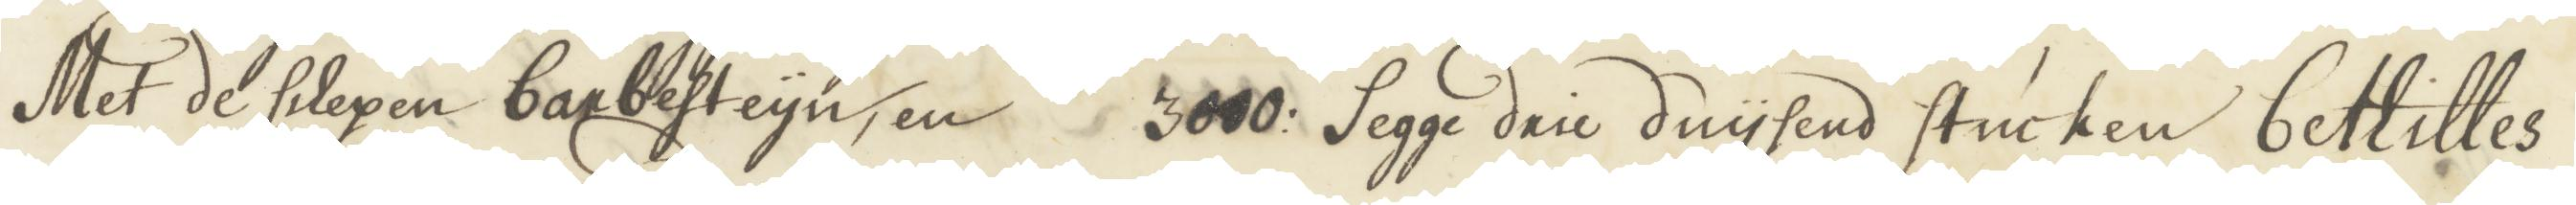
Met de schepen barbesteijn, en 3000: segge drie duijsend stucken bethilles
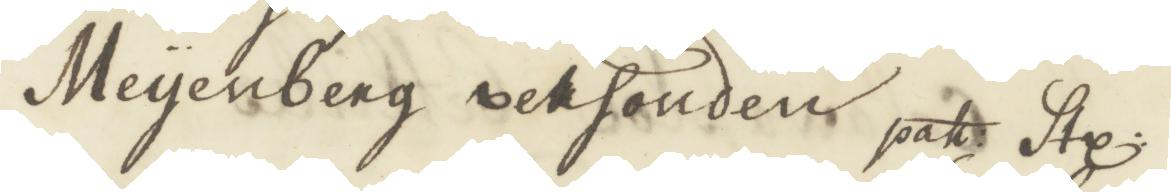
Meijenberg versonden pak stx:
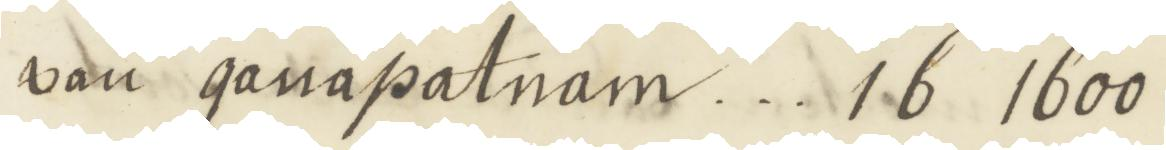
van ganapatnam - - - 16 1600
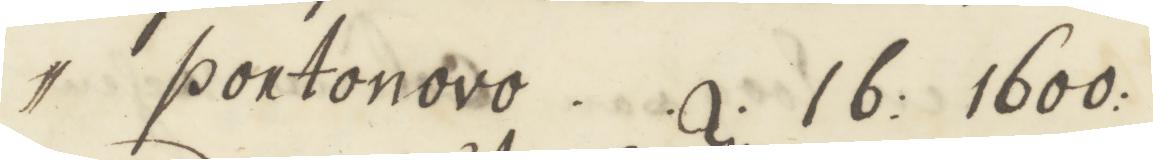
„ portonovo - - - 16: 1600:
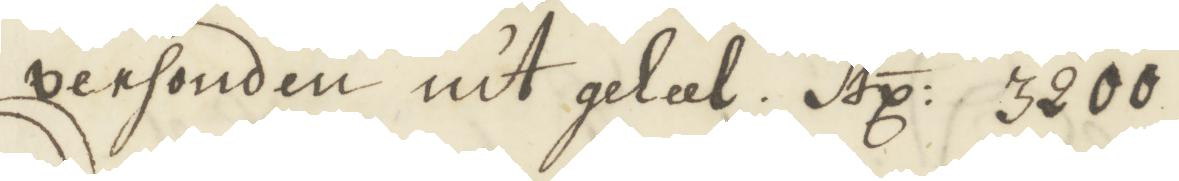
versonden in't geheel. stx: 3200
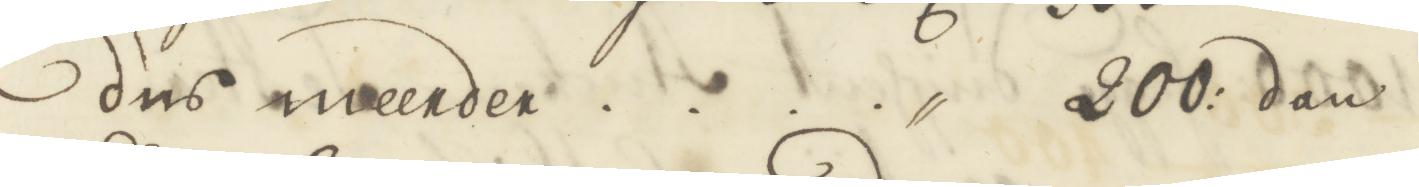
dus meerder - - - - „ 200: dan
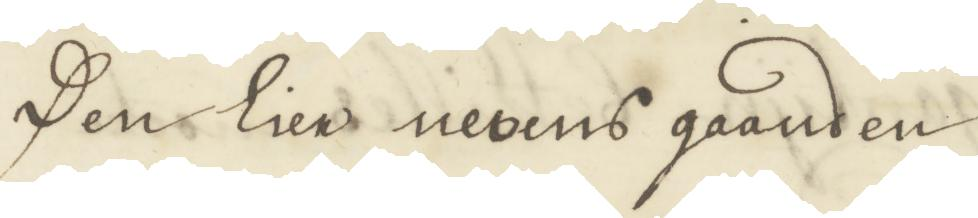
Een hier nevens gaanden
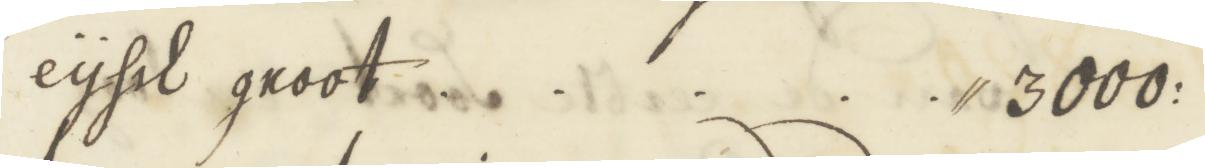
eijsch groot - - - - - „ 3000:
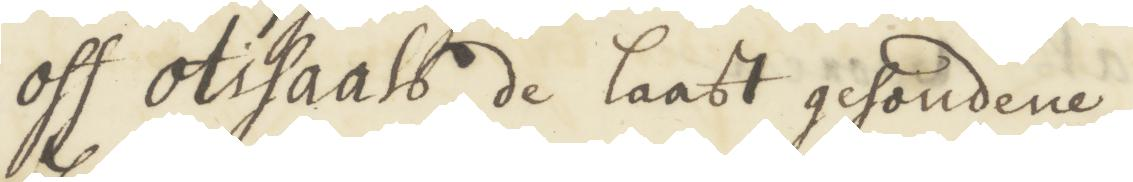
off otisaals de laast gesondene
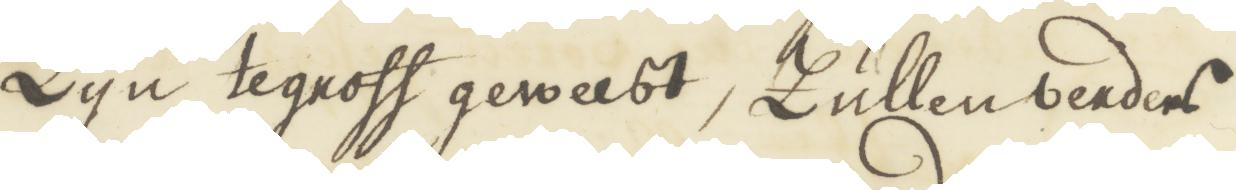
Zyn te groff geweest, Zullen verders
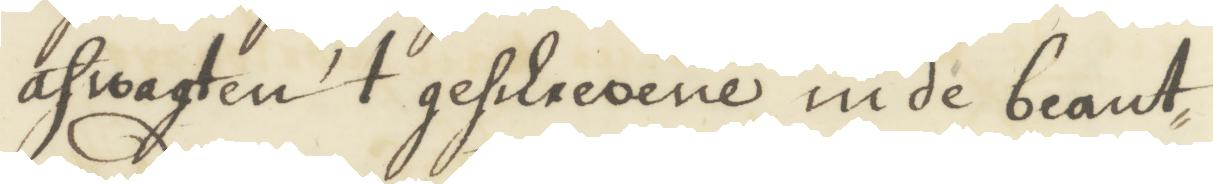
afwagten ’t geschrevene in de beant„
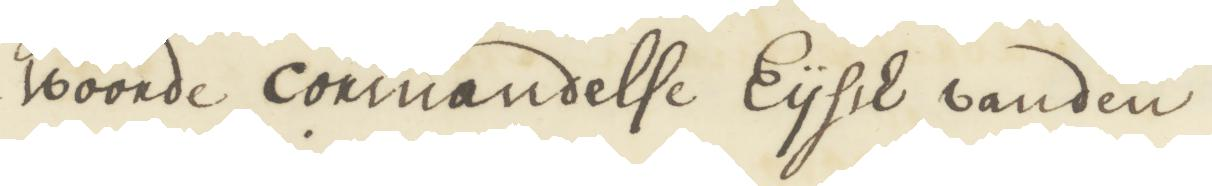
woorde Cormandelse Eijsch vanden
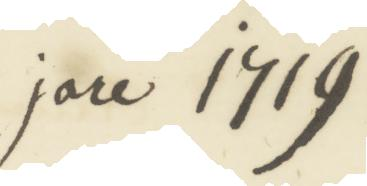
jare 1719
